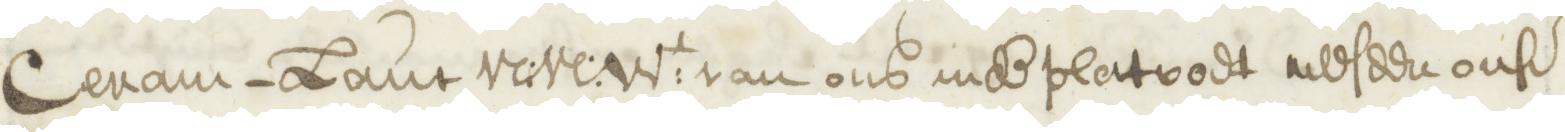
Ceram-Laut ve:ve:w:t van ons in de platvoet reefden onse
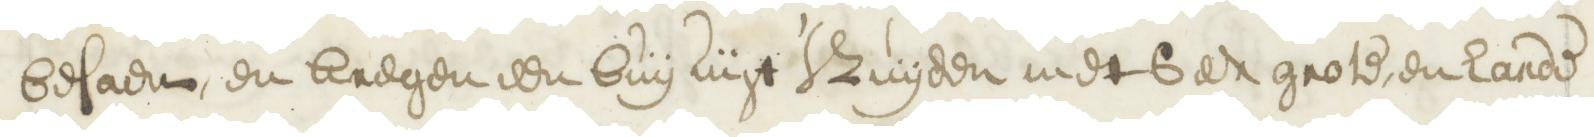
besaen, en kregen een buij uijt 'tzuijden met seer grote, en harde
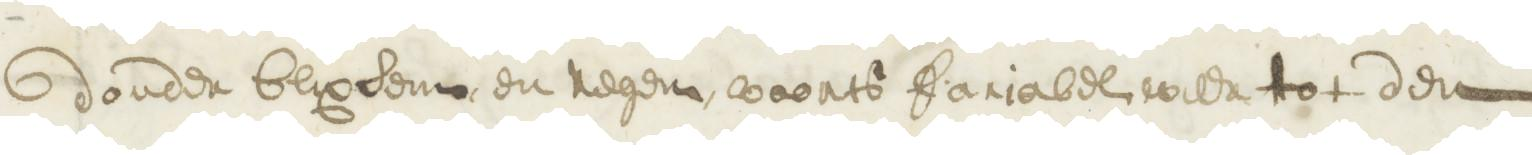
donder blixsem, en regen, voorts fariabel weer tot den
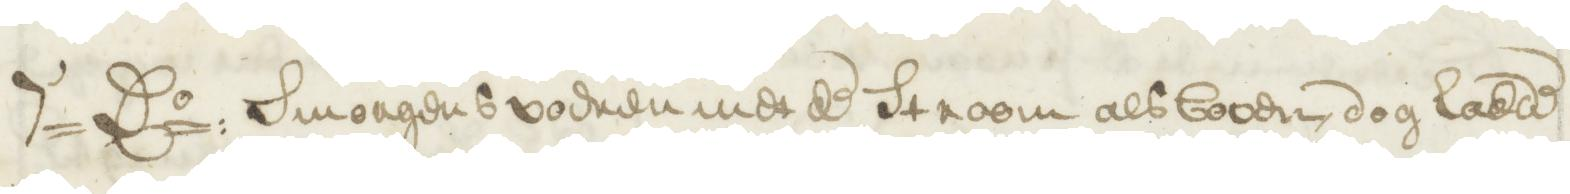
7=e D=o: smorgens voeren met de stroom als boven, dog hadde
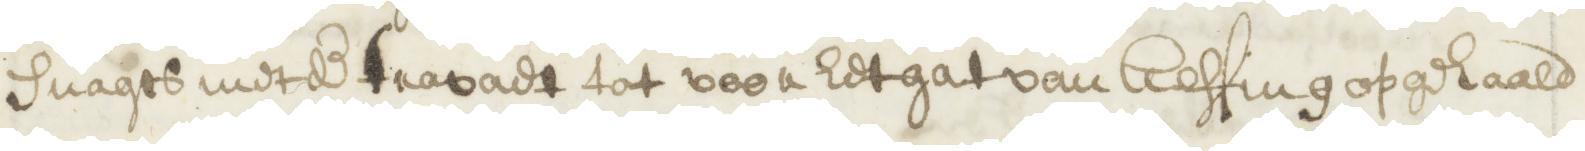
snagts met de travaet tot voor hetgatvan kessing opgehaald
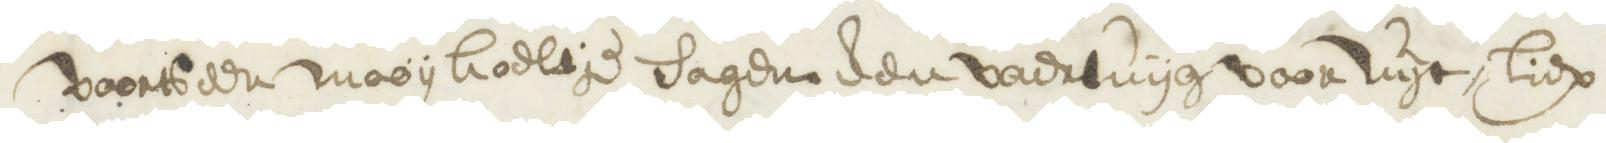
voorts een moeij koeltje sagen Een vaertuijg voor uijt, liep
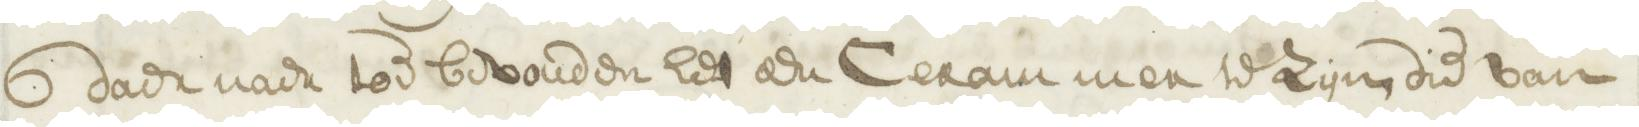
daer naer toe bevonden het den Cerammer te zijn, die van
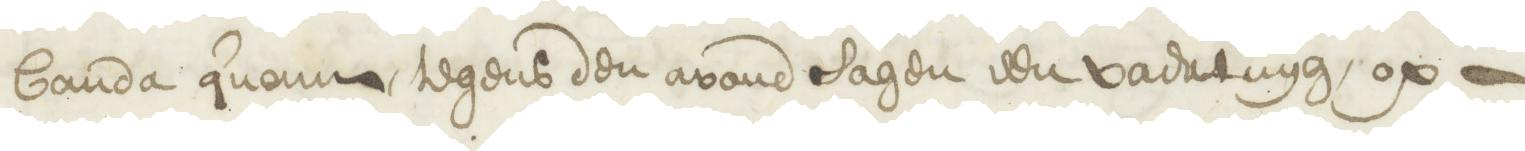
banda quam, tegens den avond sagen een vaertuijg, op —
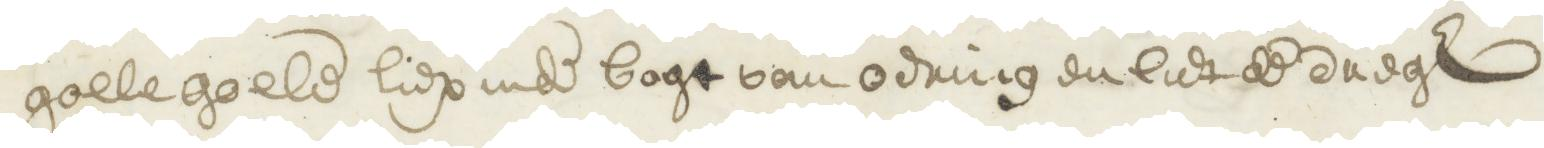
goele goele liep inde bogt van oering en liet de dregh
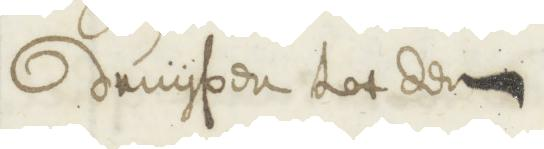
druijpen tot den
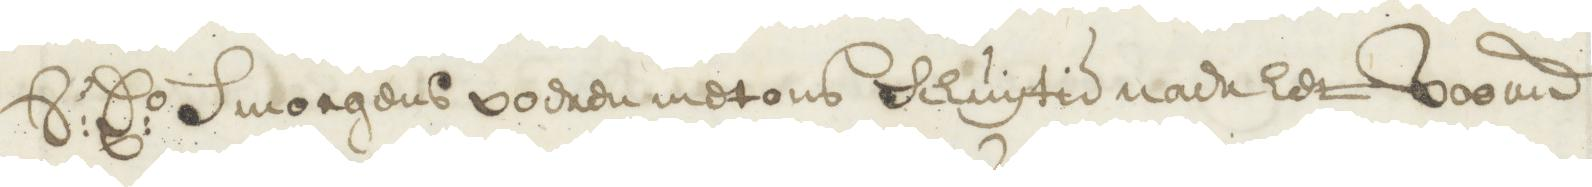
8:e D:o Smorgens voeren met ons schuijtie naer het voorn
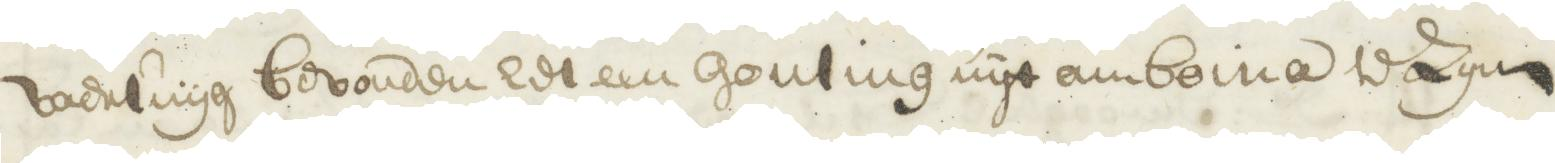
vaertuijg bevonden het een gonting uijt amboina tezyn
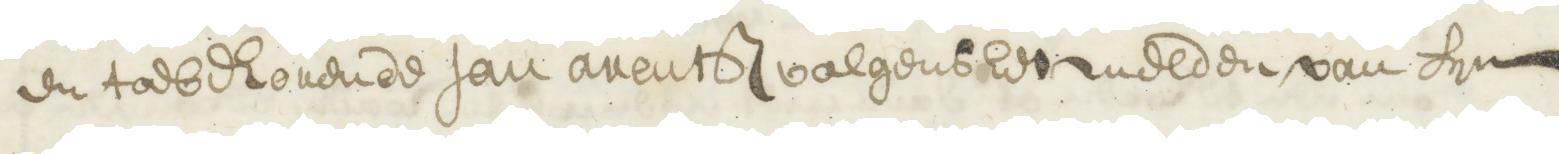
en toebehorende jan arents volgens het melden van syn
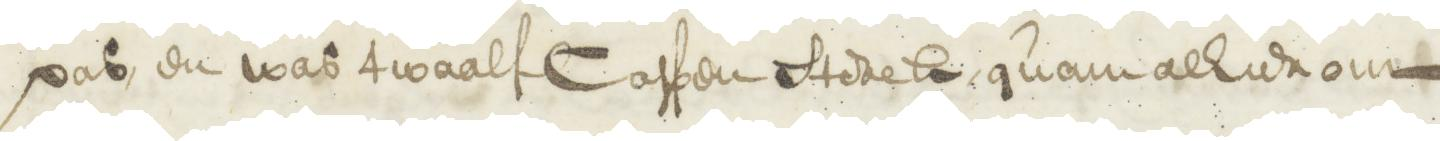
pas, en was twaalf Coppen sterck, quam alhier om
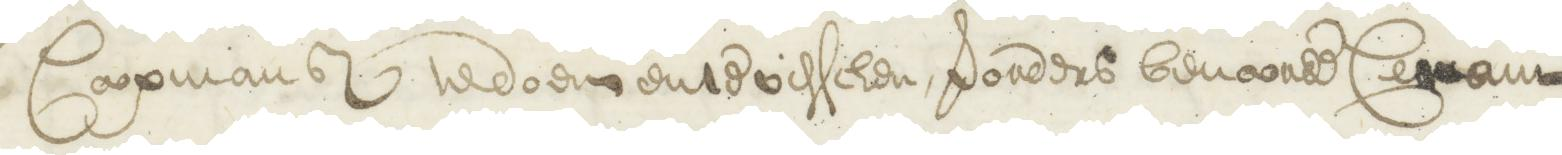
Coopmansz tedoen ente visschen, verorders benoorde Ceram
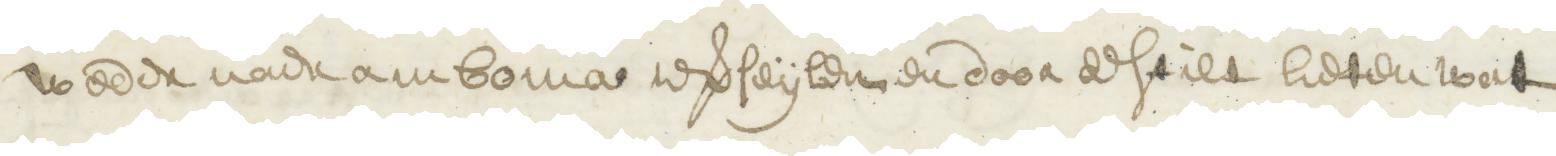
weder naer amboina te verseijlen en door destilt heten wat
